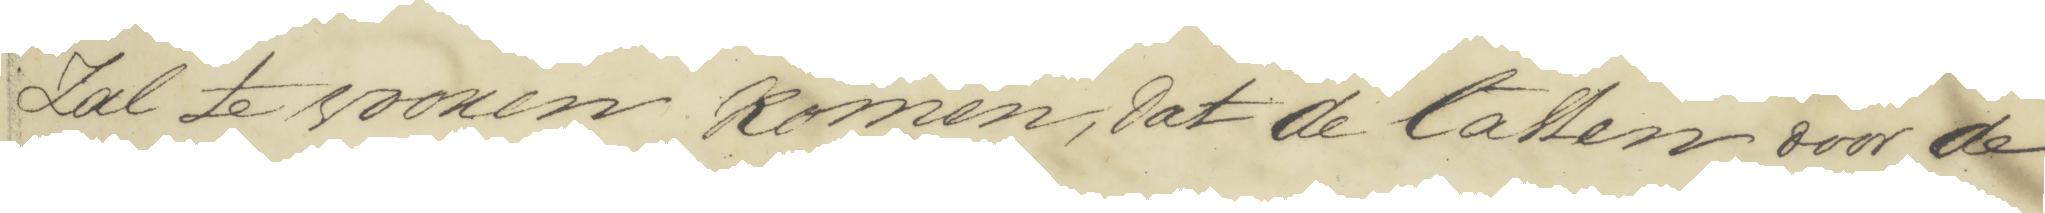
Zal te vooren komen, dat de lasten, door de
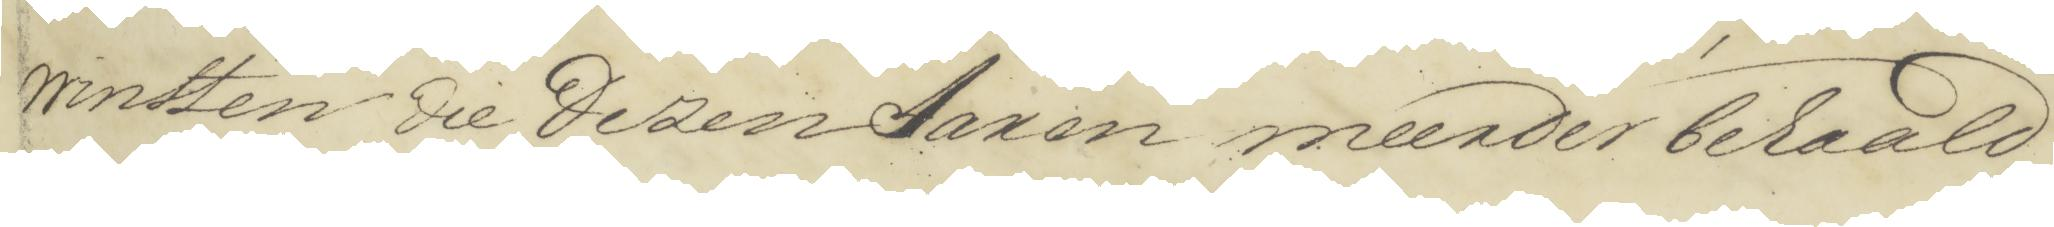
winsten die dezen Iaren meerder behaald
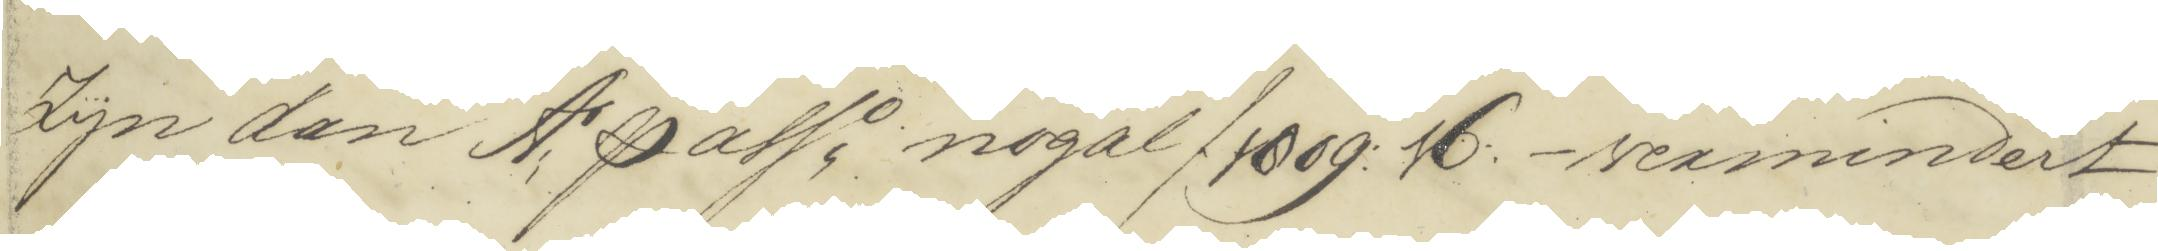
Zijn dan A:o pass„o nogal ƒ1809:16:— vermindert
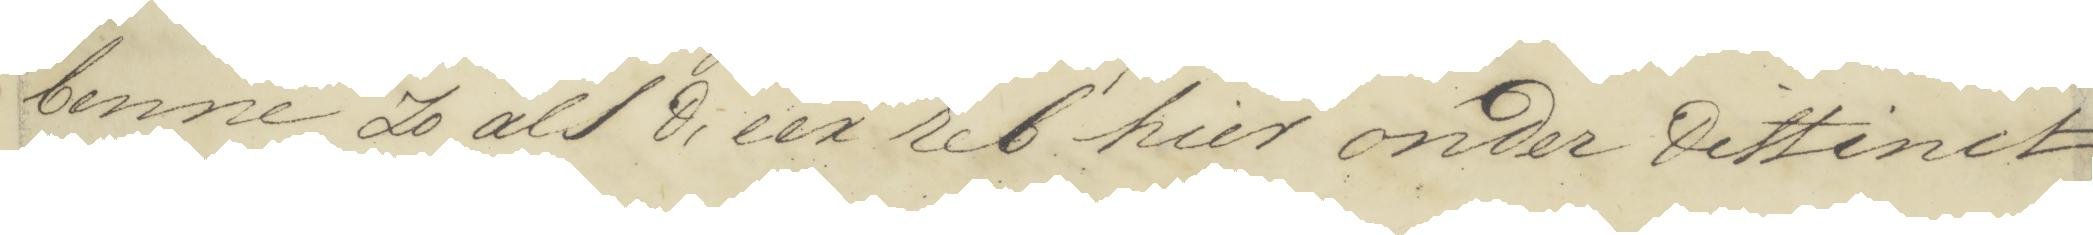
benne zo als d, eer heb hier onder distinct
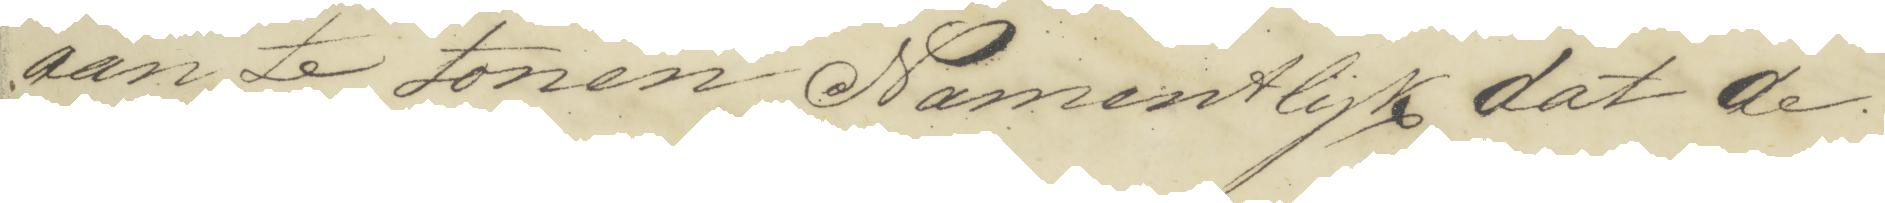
aan te tonen Namentlijk dat de
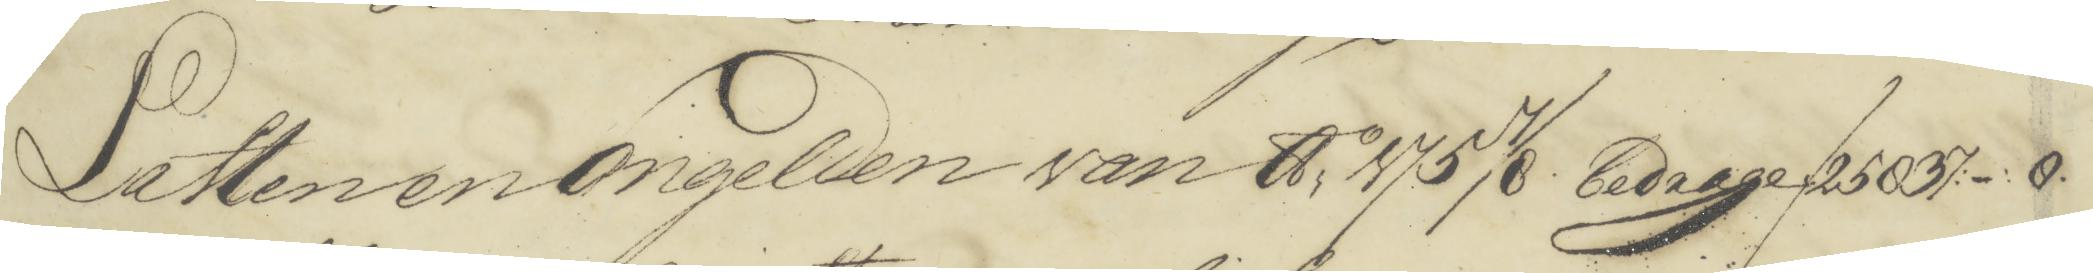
Lasten en ongelden van A„o 175 7/8 bedrage ƒ25837: - :8.
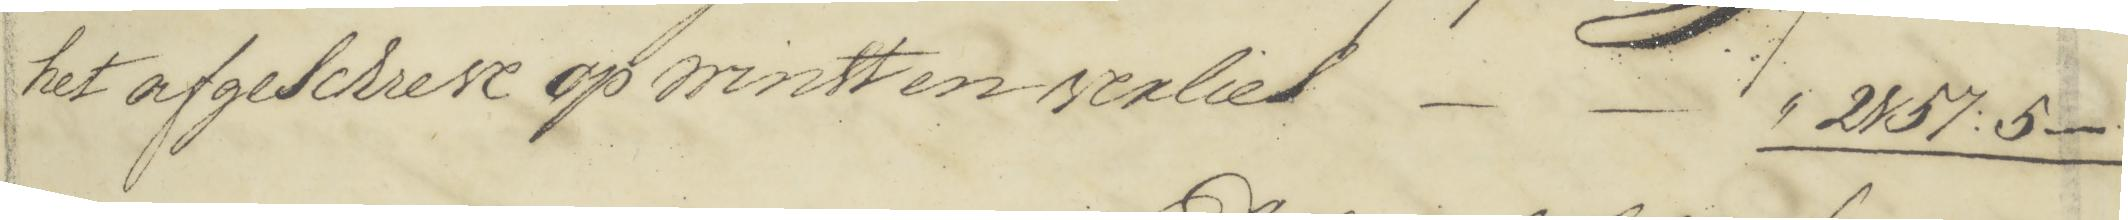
het afgeschreve op winst en verlies — — „ 2157: 5:—
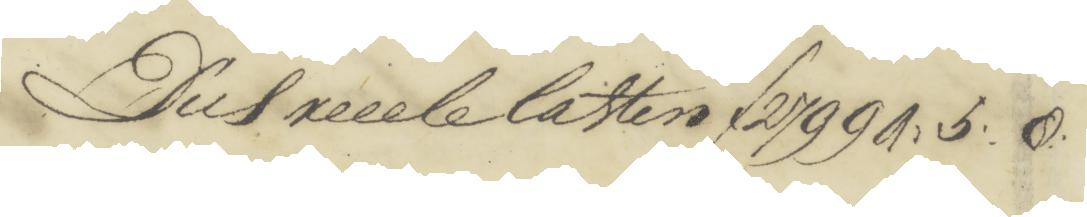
Dus reeele lasten ƒ27994:5:8:
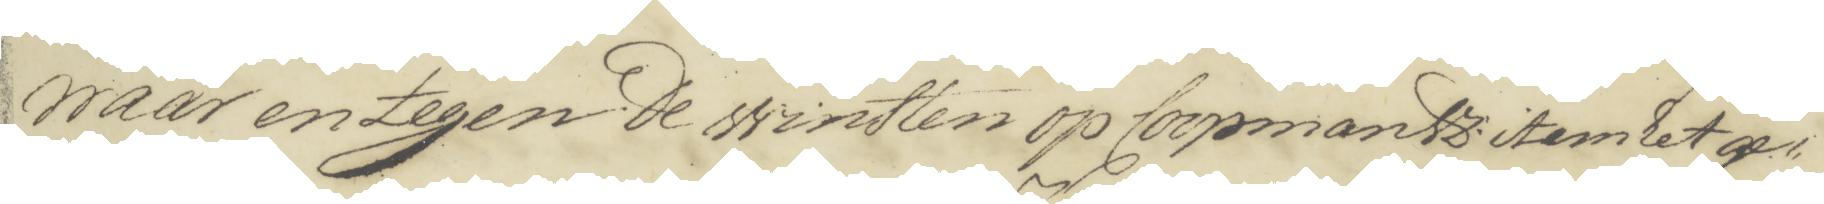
waar en tegen de winsten op Coopmantz item het ge„
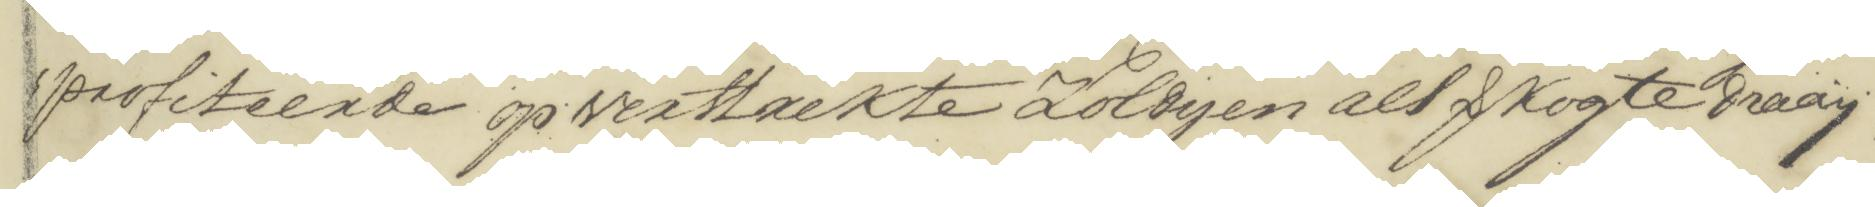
„profiteerde op verstrekte Zoldijen als verkogte draaij
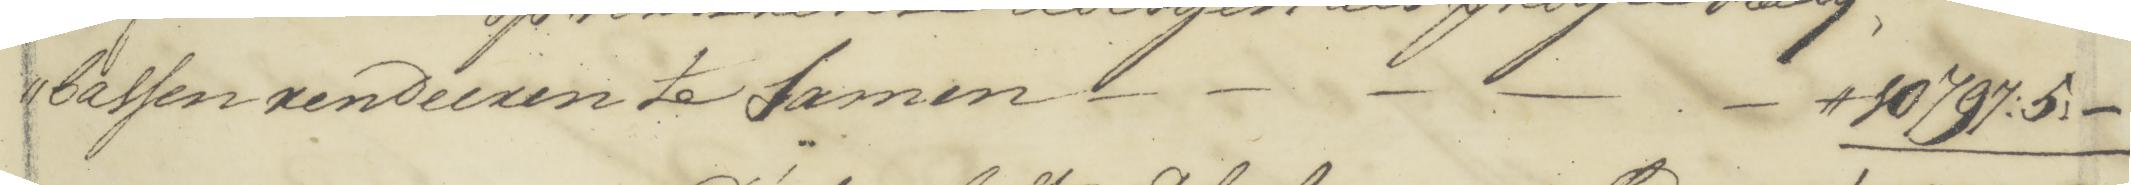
„bassen rendeeren te samen — — — — — „ 10797: 5: -
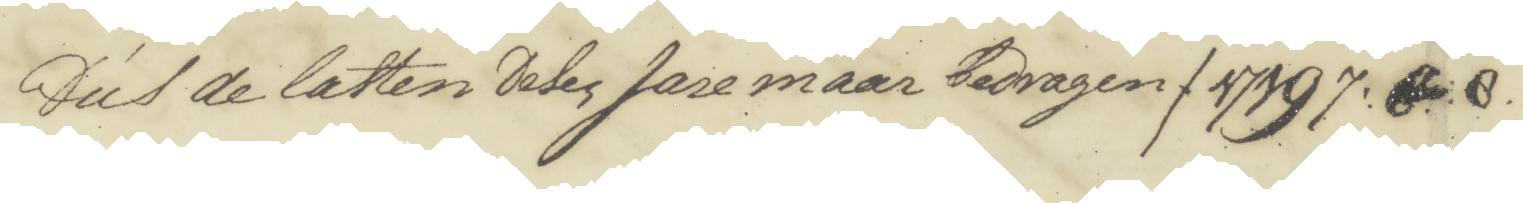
dus de lasten desen Jare maar bedragen ƒ17197: 8: 8.
